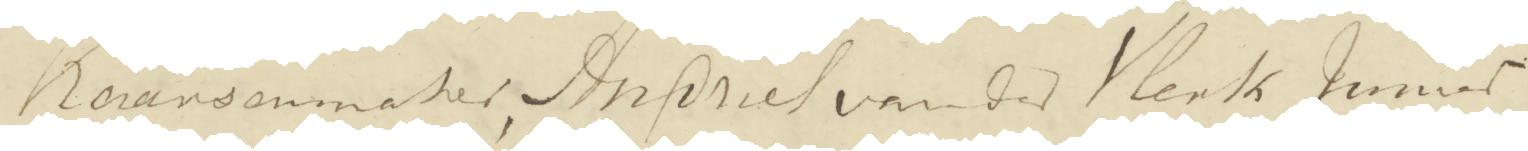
Kaarsenmaker, Andries van der Vlerk Junior
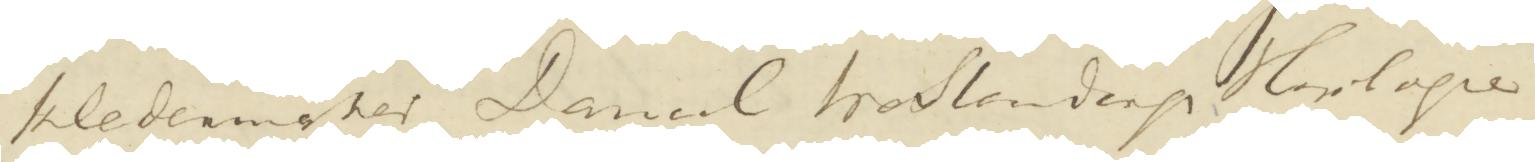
kledermaker, Daniel Westendorp, Horologie
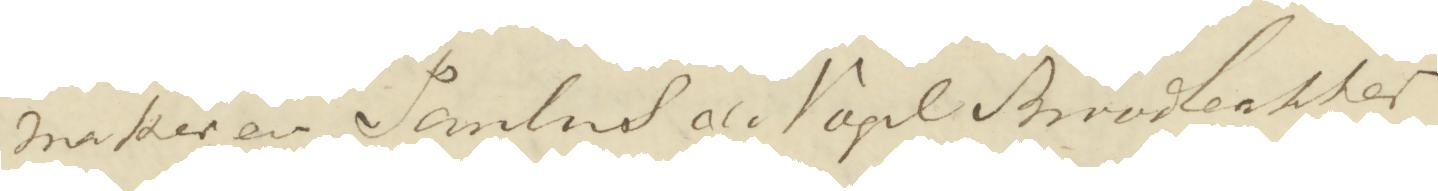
maker, en, Paulus de Vogel Brodbakker
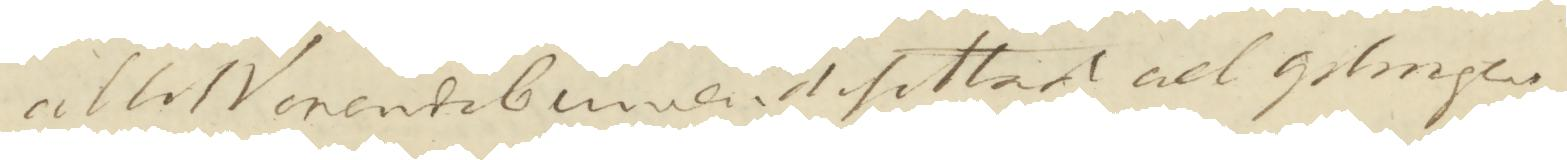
alle Wonende binnen dese Stad ael getuigten
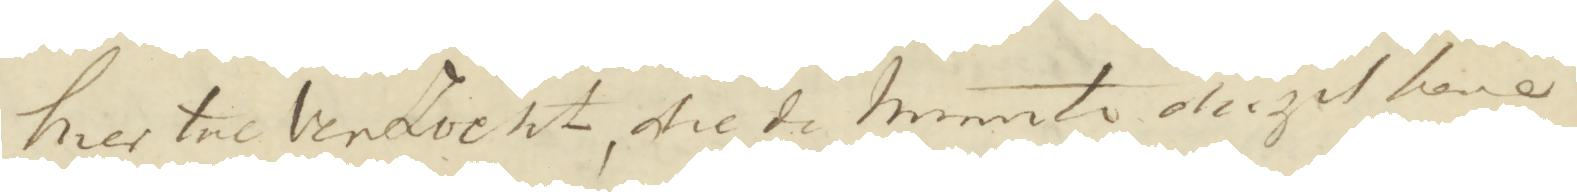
hier tre verzocht, die de minute dezes bene
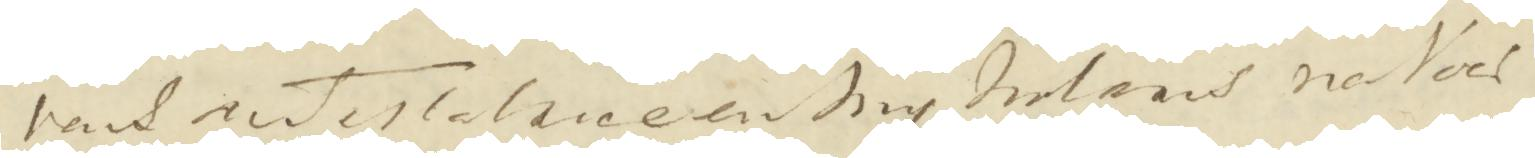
vens Testatrice en my Notaris na Voor
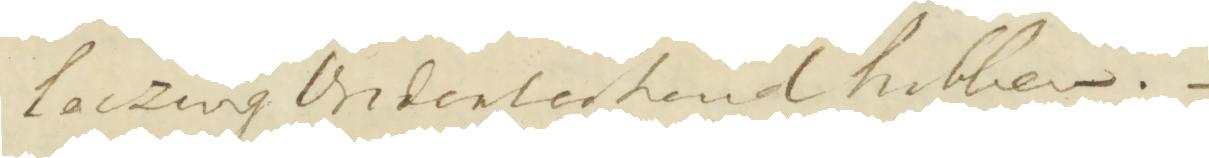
leezing onderterkend hebben.-
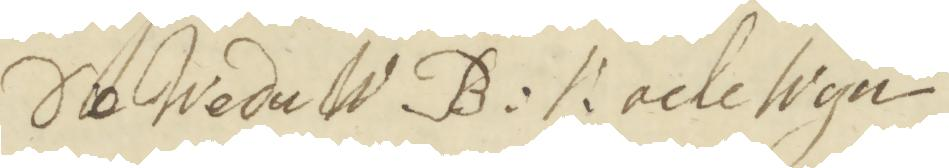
de Weduwe B: Koelewyn
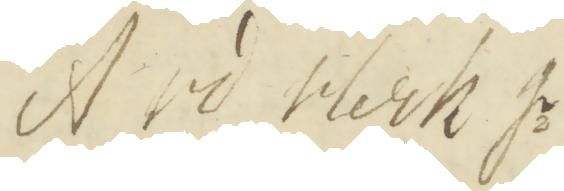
A vd Vlerk J=r
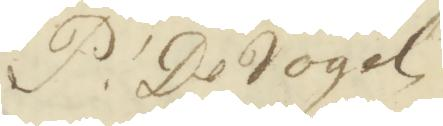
P. 'De Vogel
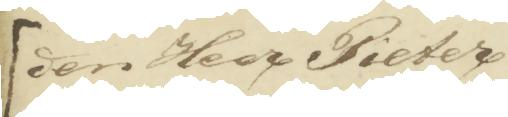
den Heer Pieter
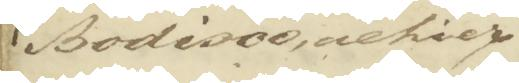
Bodisco, alhier
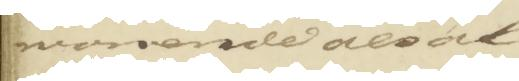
wonende als al
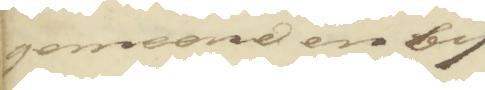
gemeene en by
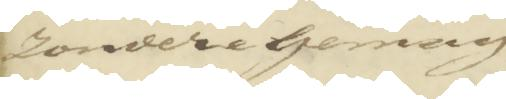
zondere Gemag
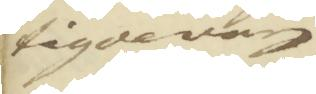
tigde van
